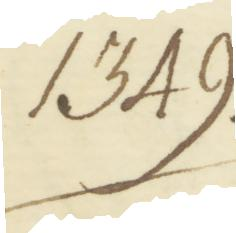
1349.
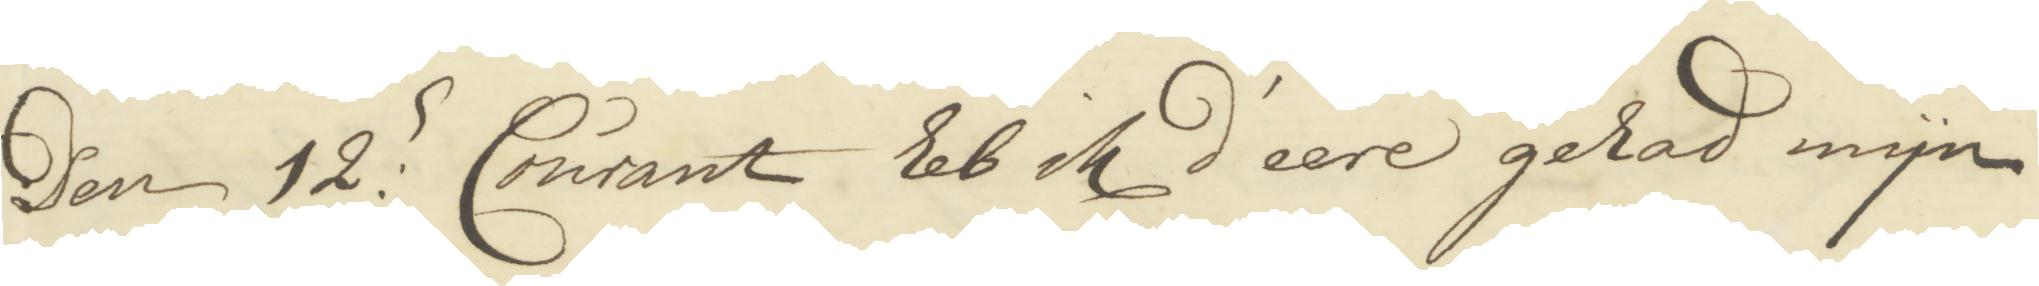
Den 12:' Courant heb ik d’eere gehad mijn
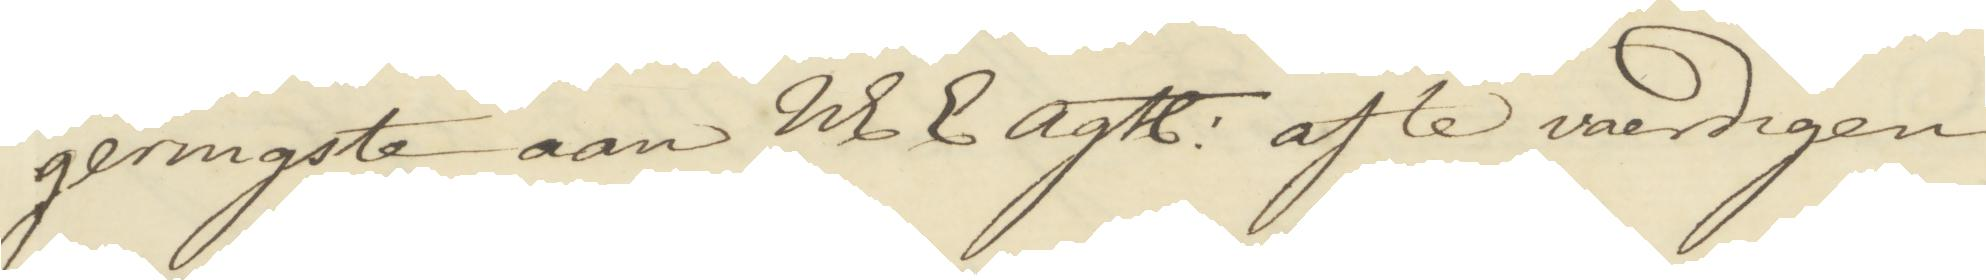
geringste aan UE E agtb: afte vaerdigen
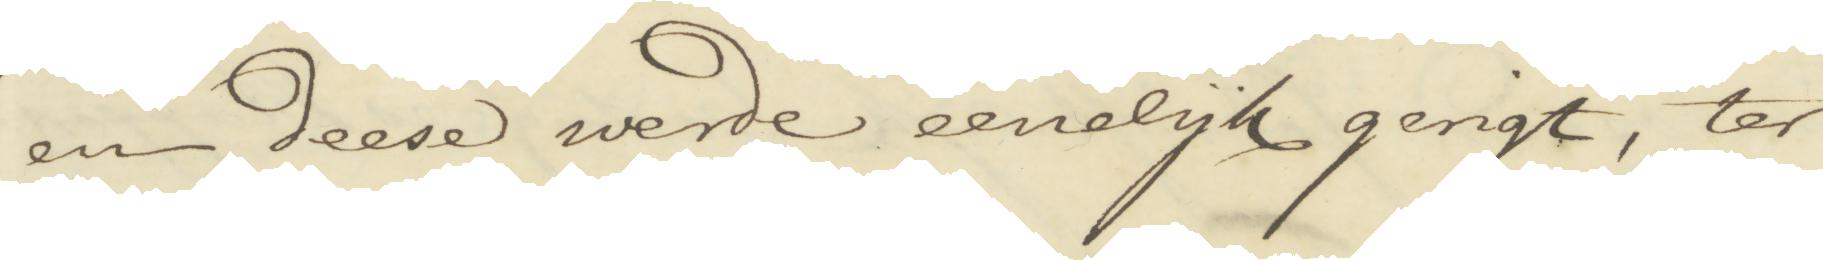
en deese werde eenelijk gerigt, ter
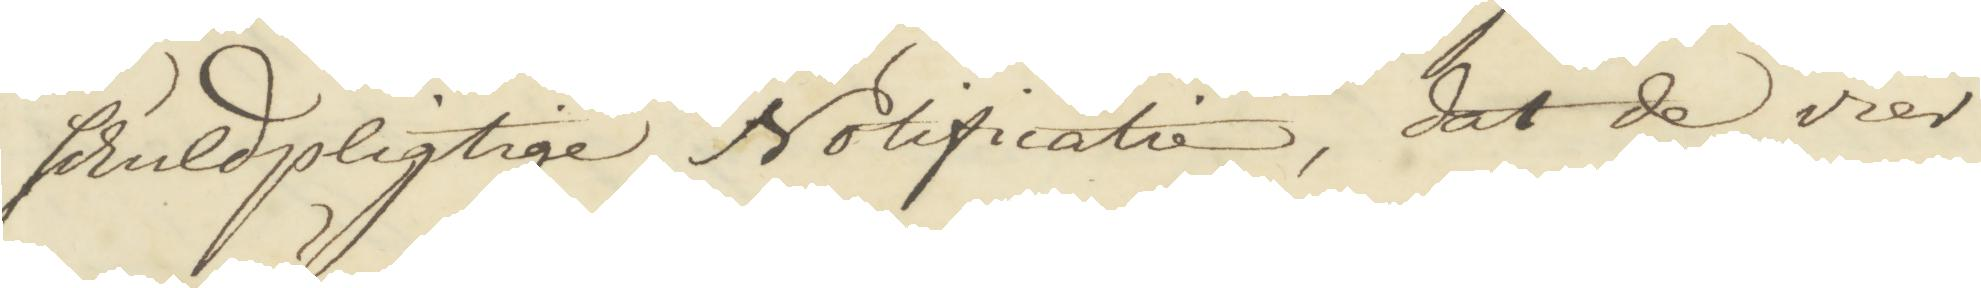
schuldpligtige Notificatie, dat de vier
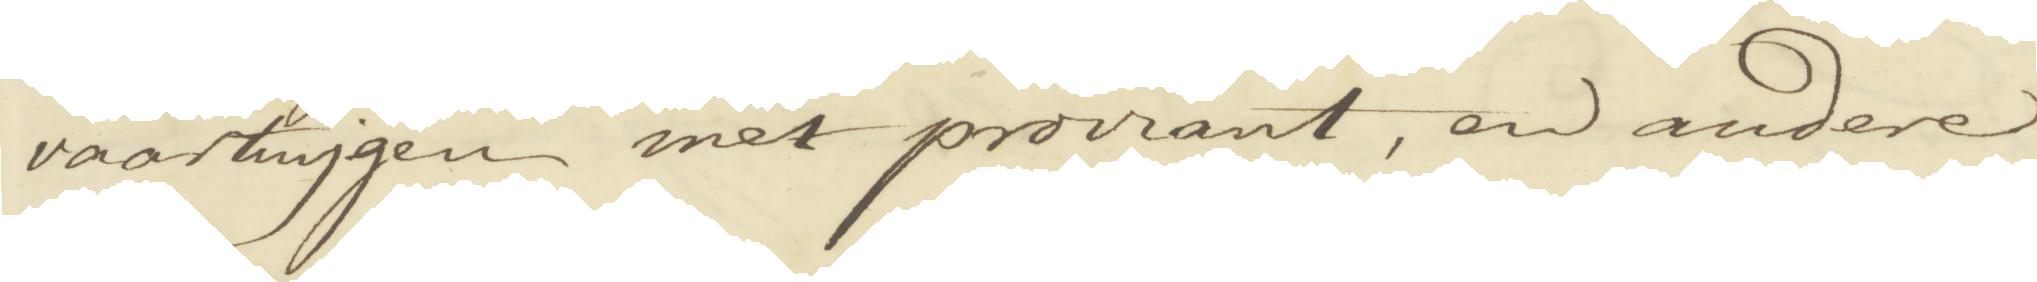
vaartuijgen met proviant, en andere
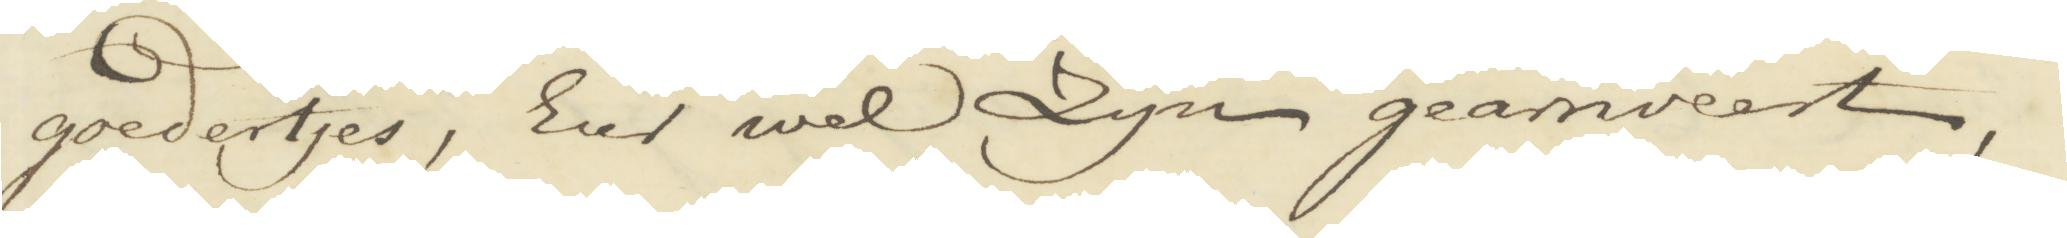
goedertjes, hier wel zijn gearriveert
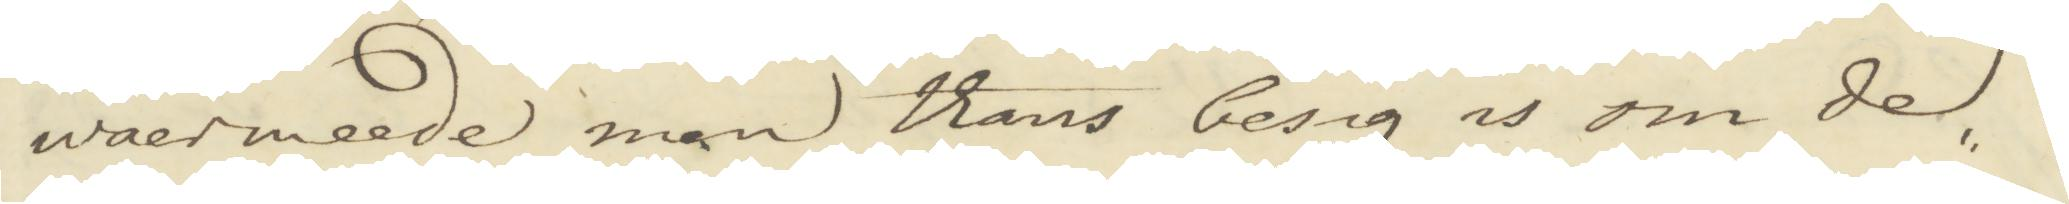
waermeede man thans besig is om de„
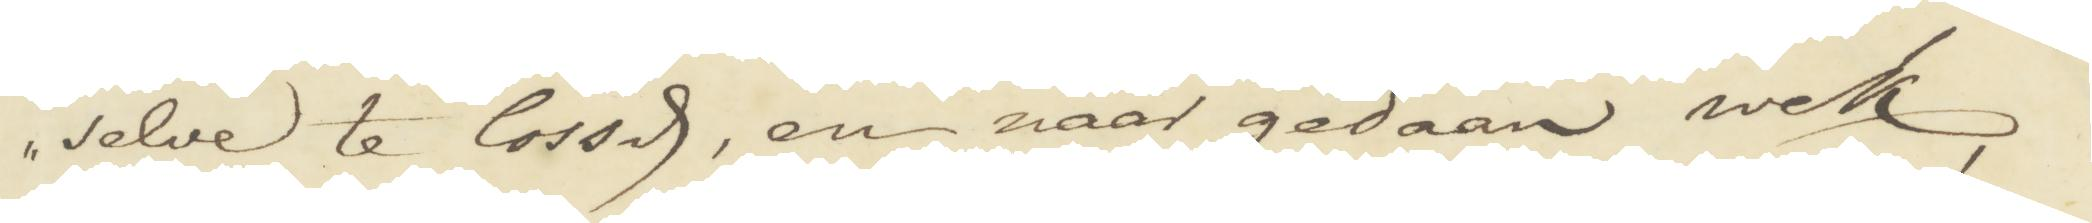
„selve te lossen, en naar gedaan wek,
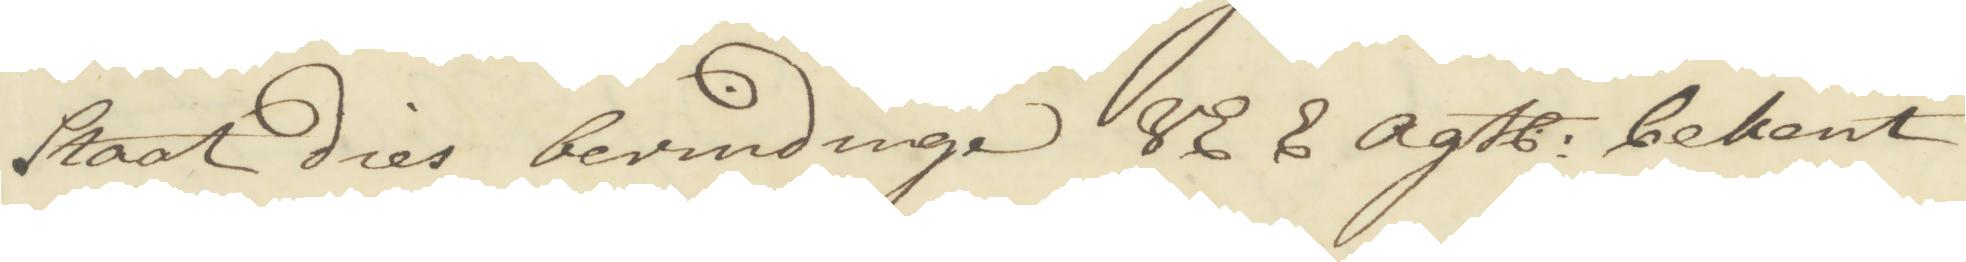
staat dies bevindinge VE E agtb: bekent
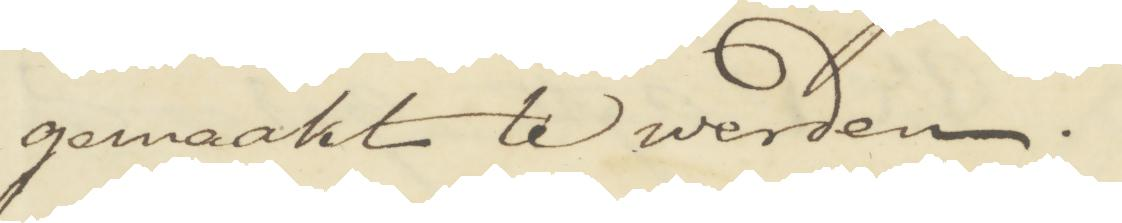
gemaakt te werden.
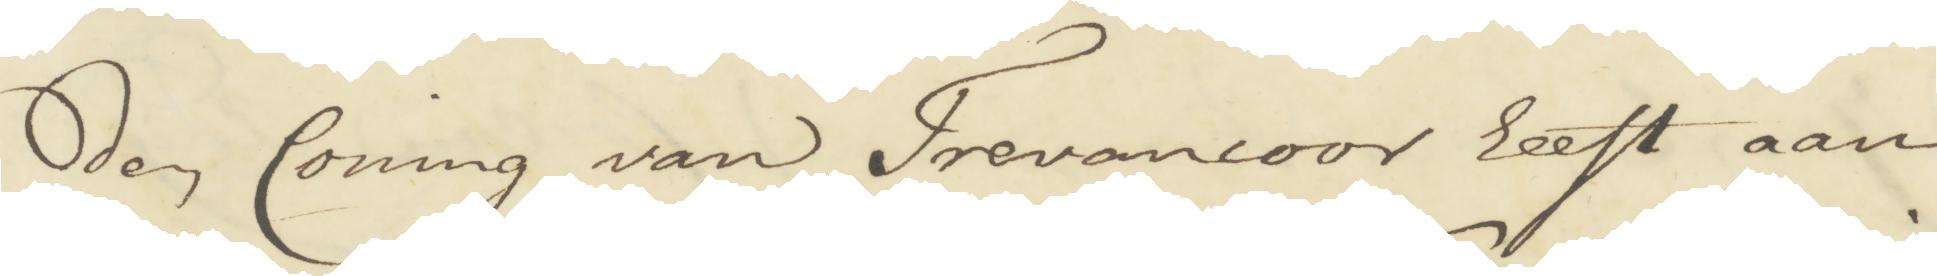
den Coning van Trevancoor heeft aan
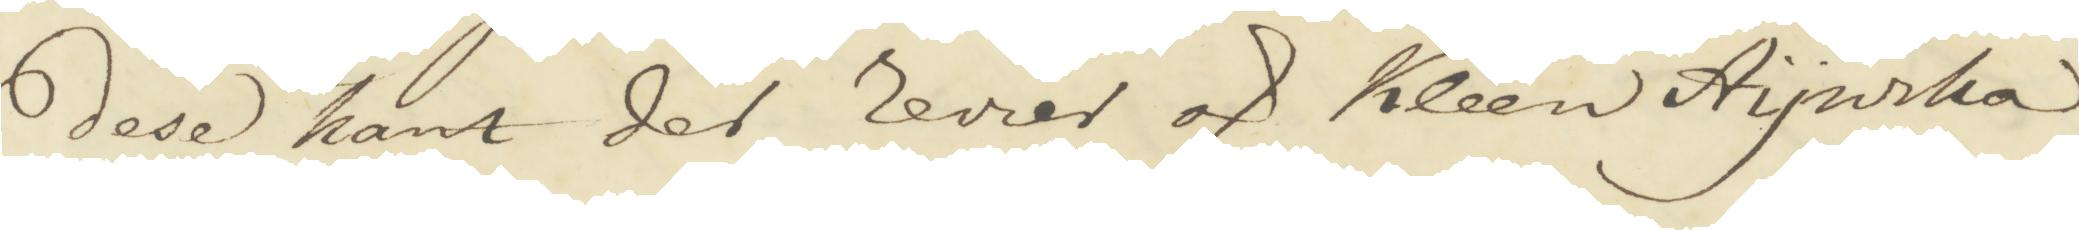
dese kant des revier over kleen Aijwika
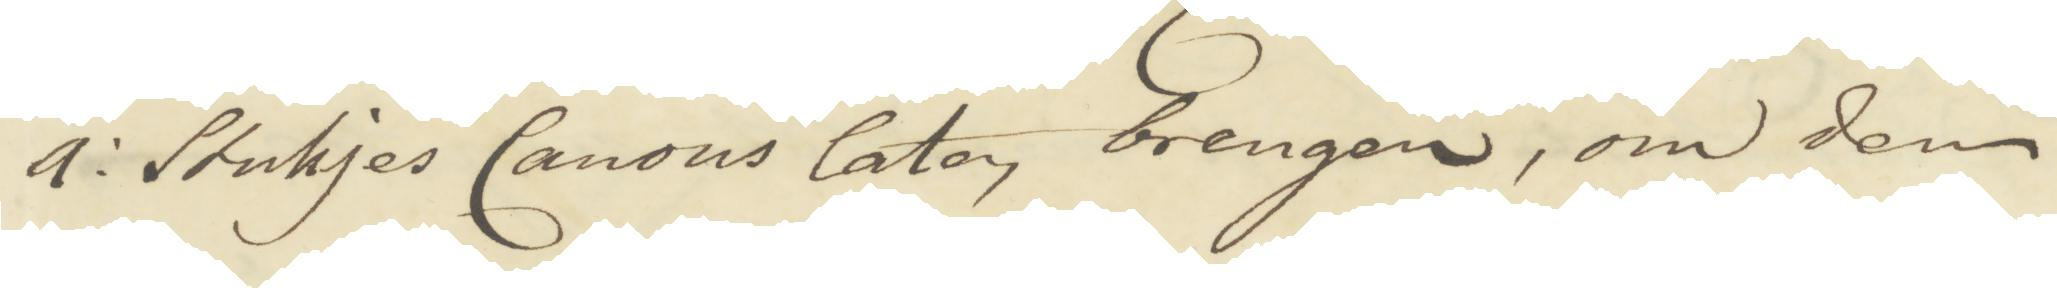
4: stukjes Canons laten brengen, om den
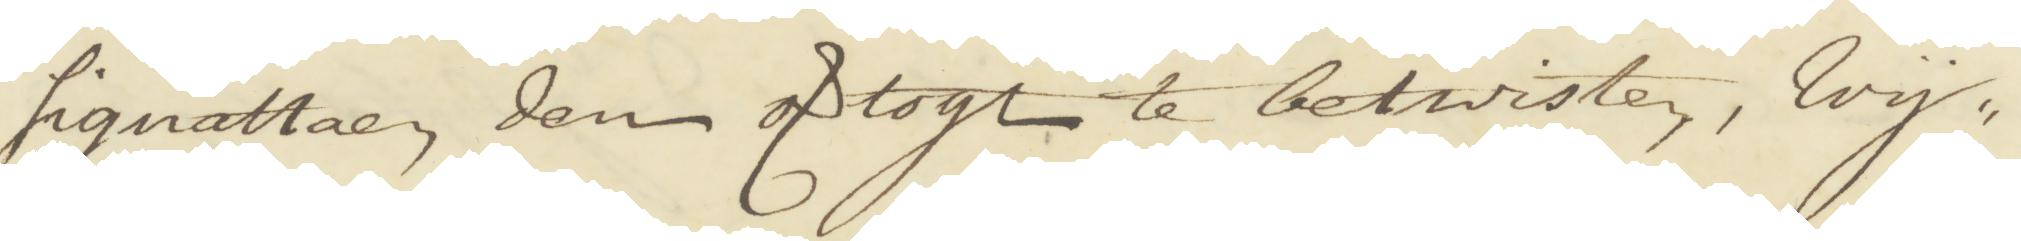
signattaen den overtogt te betwisten, wij„
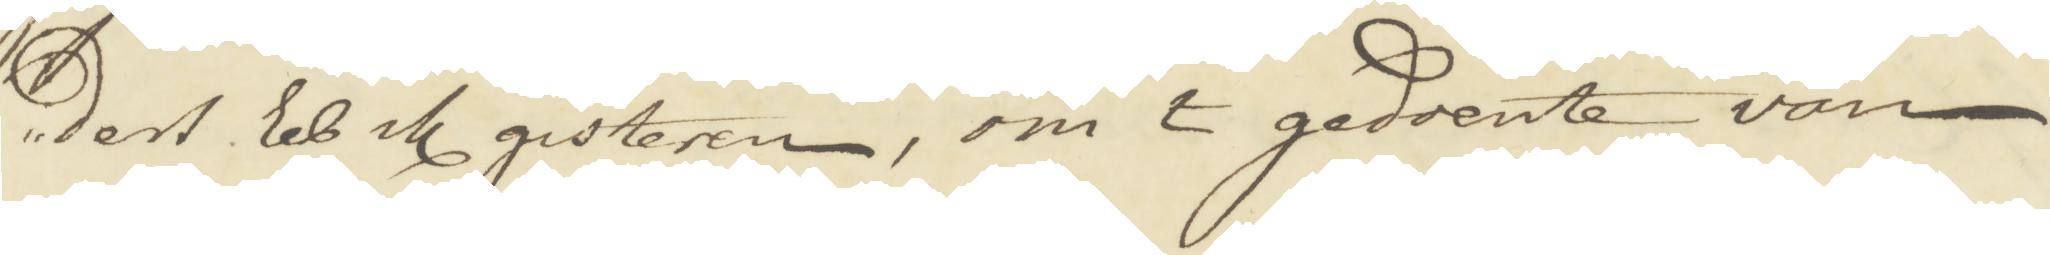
„ders heb ik gisteren, om ’t gedoente van
